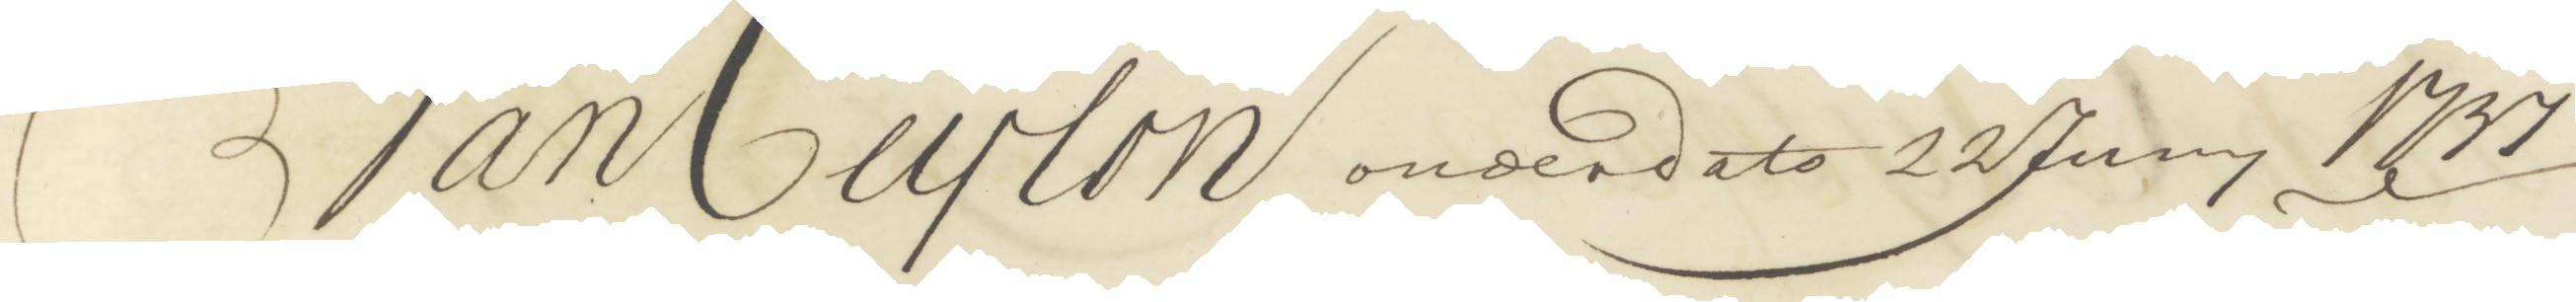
Van Ceijlon onder dato 22 Juny 1737
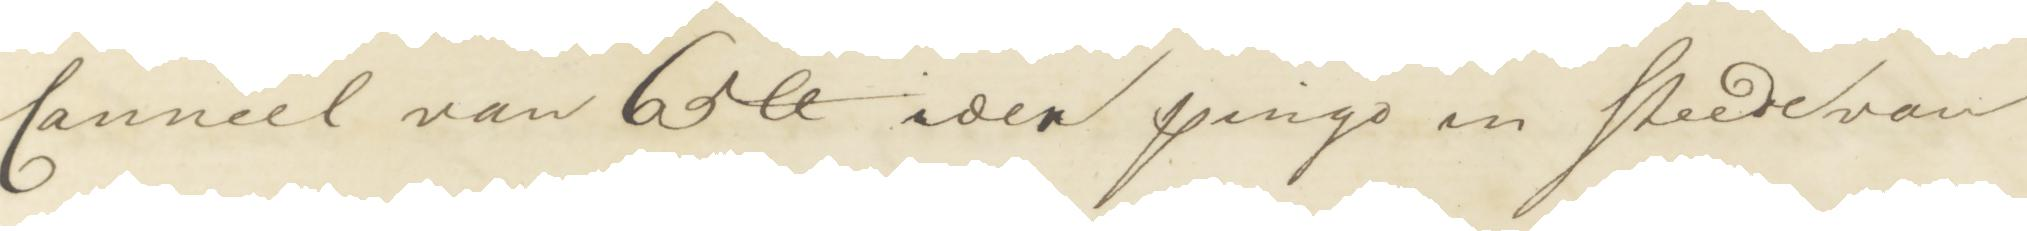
Canneel van 65 lb ider pingo in steede van
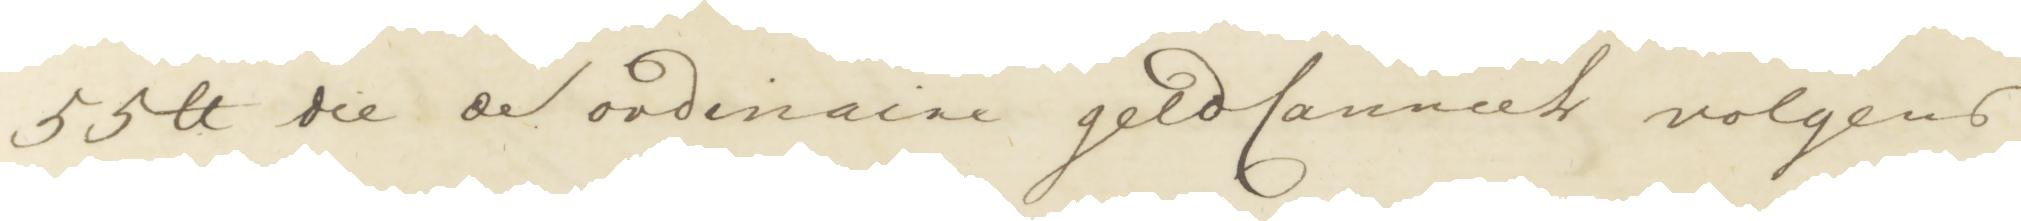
55 lb die de ordinaire geld canneel volgens
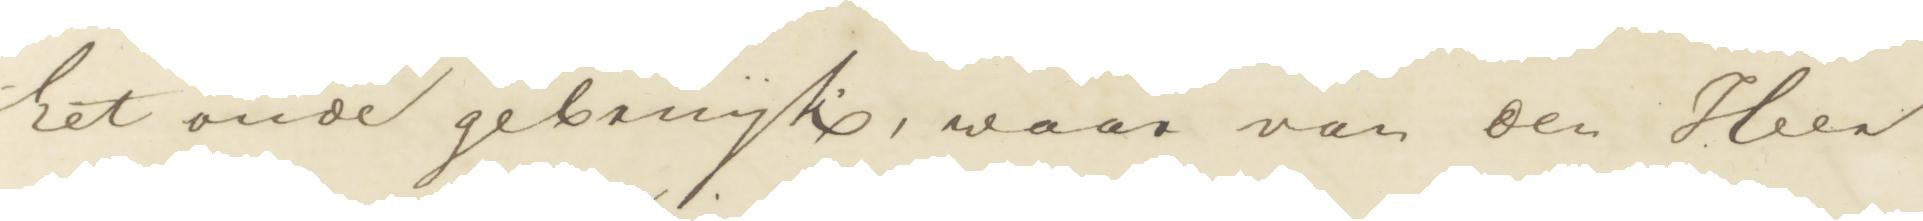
het oude gebruijk, waar van den Heer
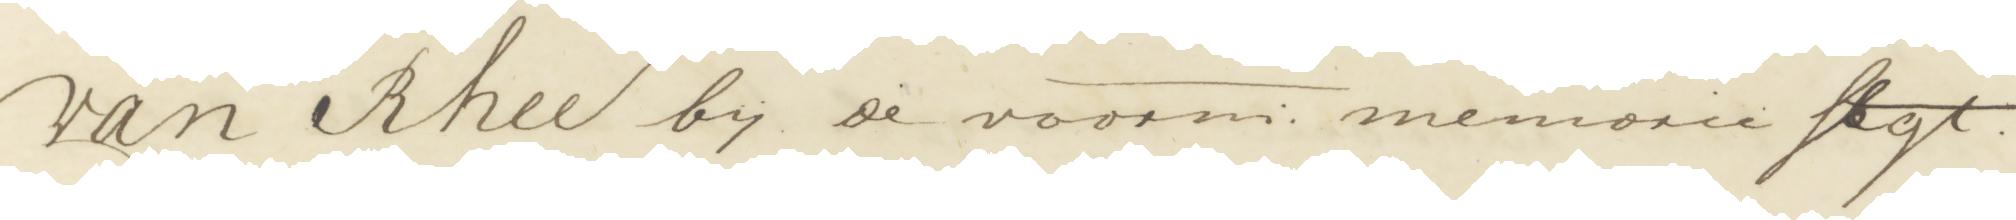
van Rhee bij de voorm: memorie segt.
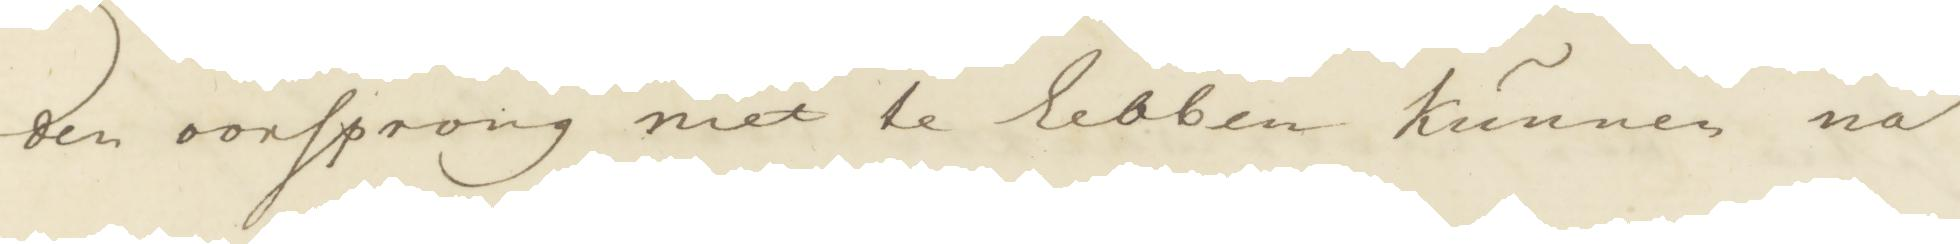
den oorsprong niet te hebben kunnen na
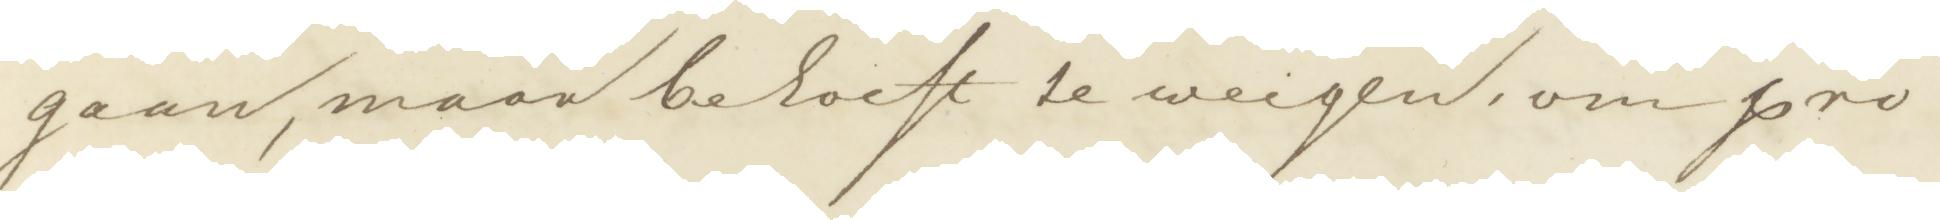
gaan, maar behoeft te weegen, om pro
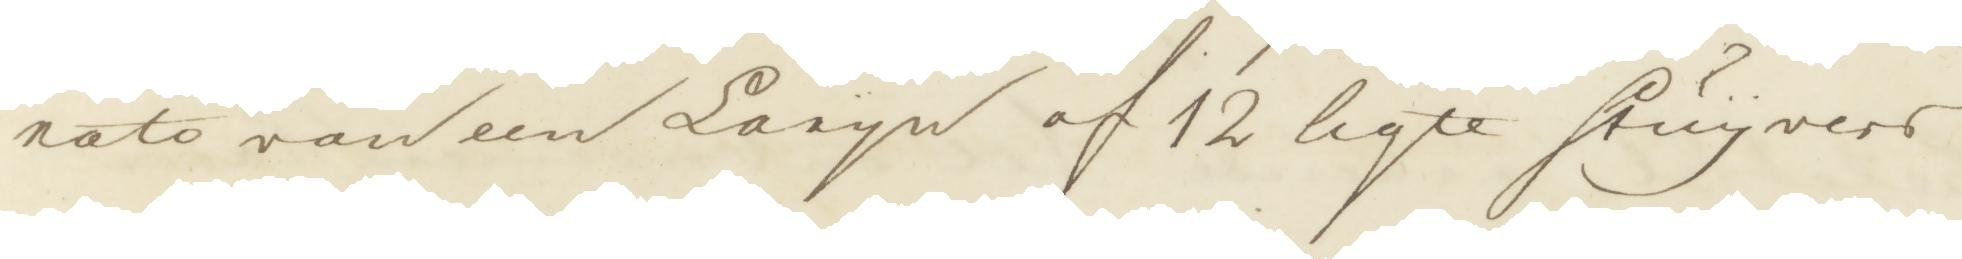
rato van een Larijn of 12 ligte stuijvers
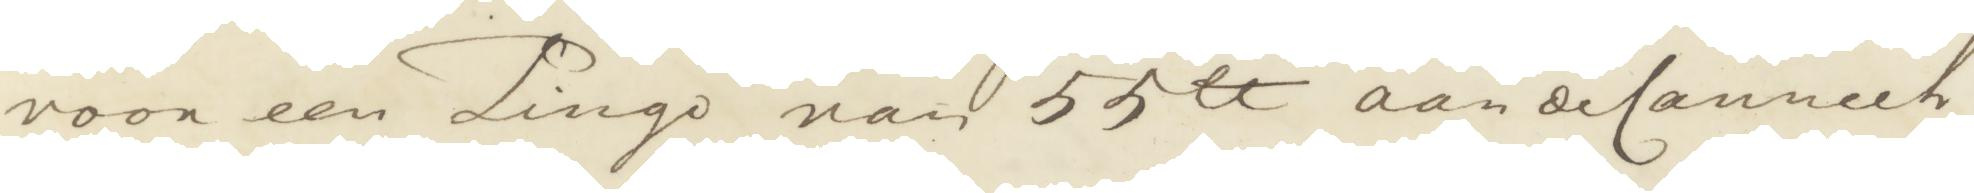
voor een Lingo van 55 lb aan de Canneel
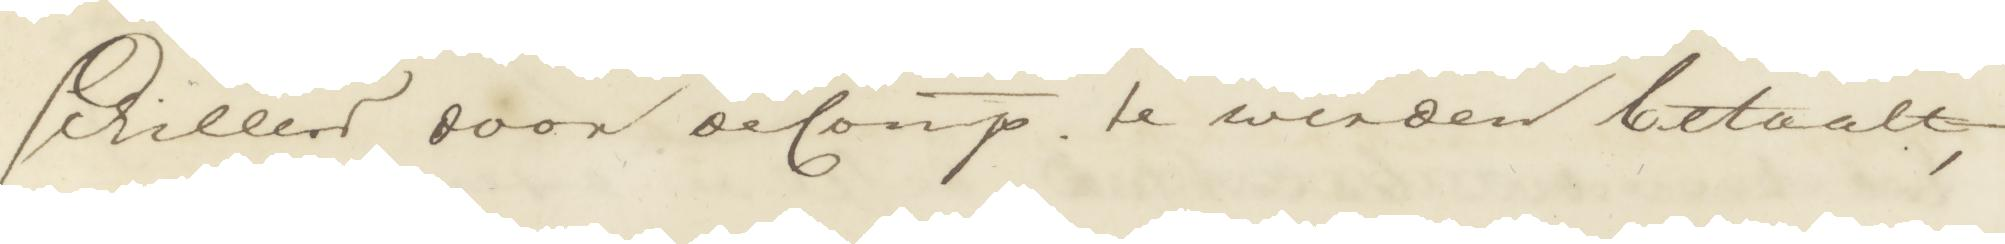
schillers door de Comp. te werden betaalt,
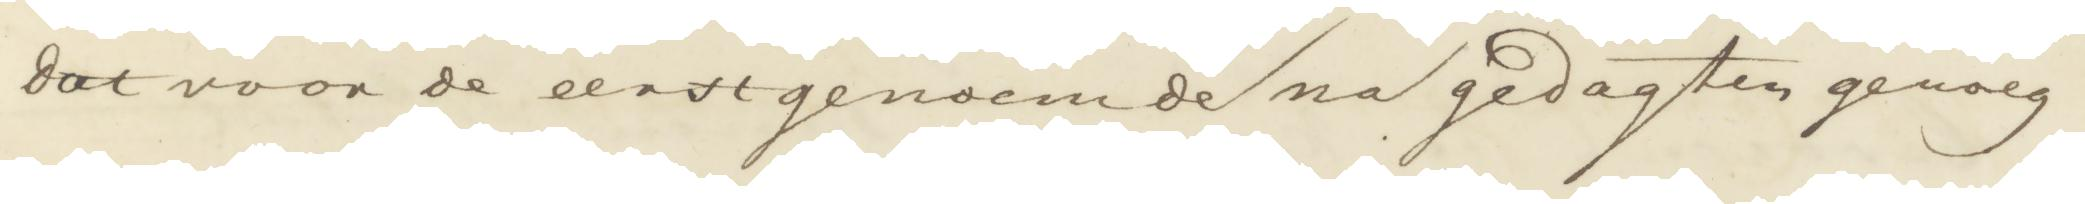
dat voor de eerst genoemde na gedagten genoeg
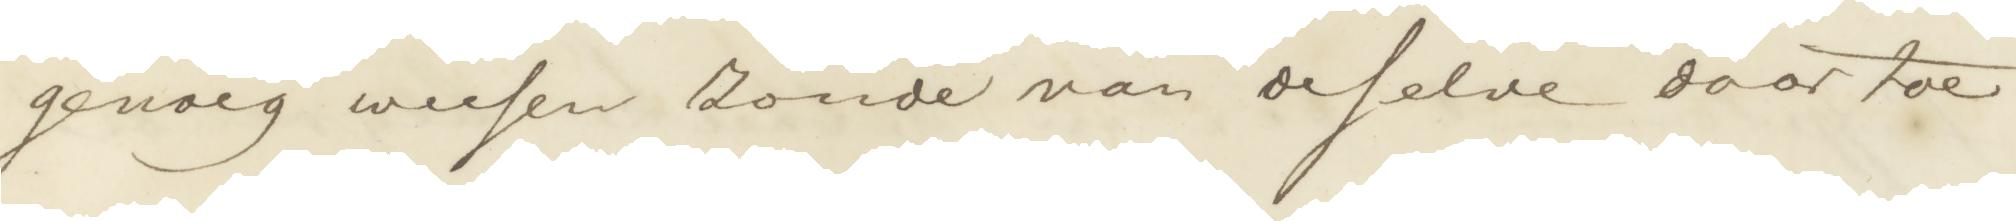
genoeg weesen zoude van deselve door toe
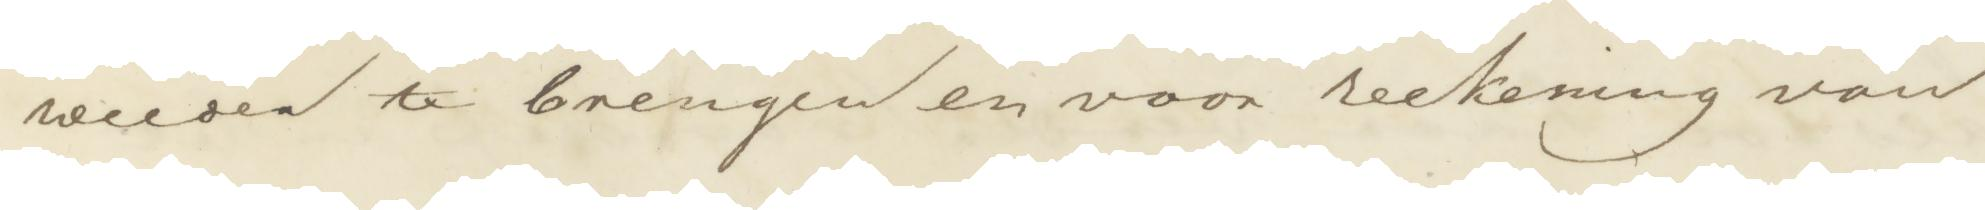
weeder te brengen en voor reekening van
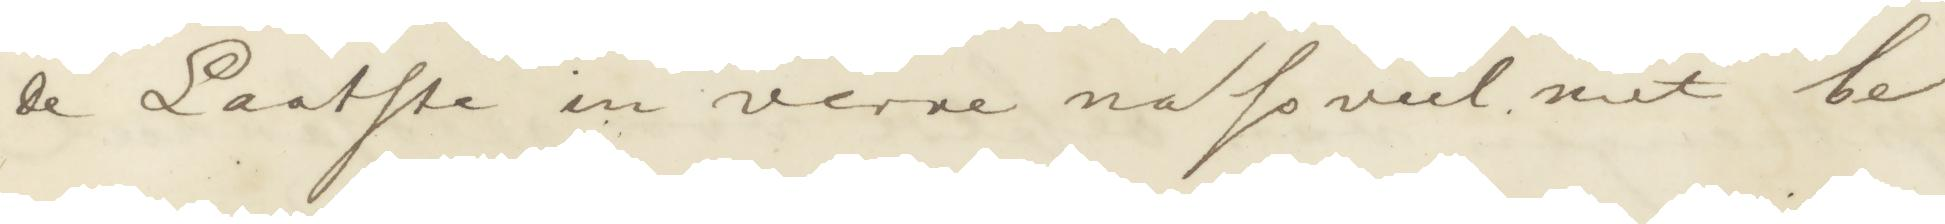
de Laatste in verre na so veel met be
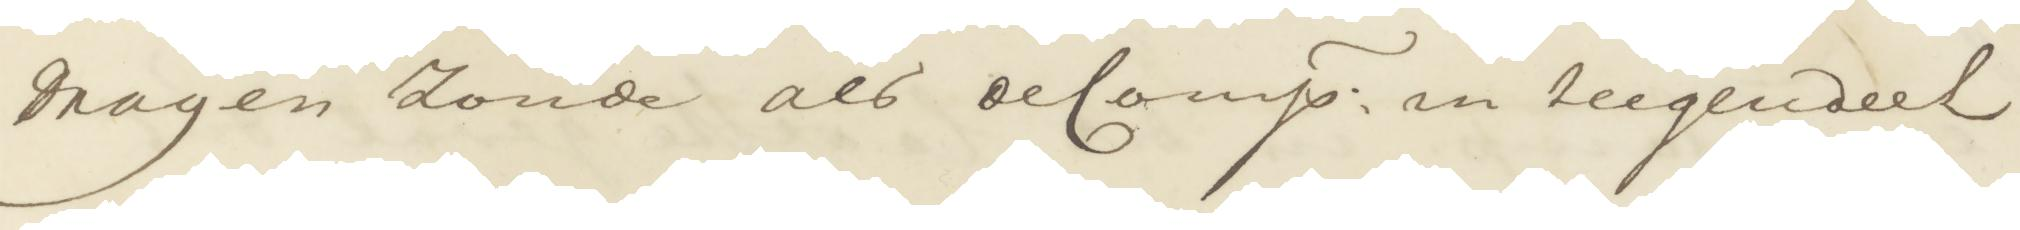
dragen zoude als de Comp: in teegendeel
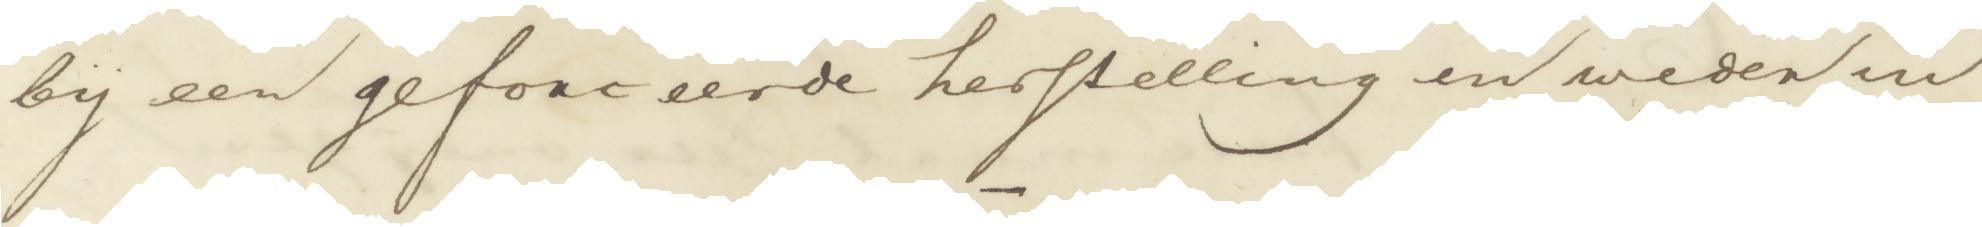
bij een geforceerde herstelling en weder in
